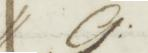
„ 9:
